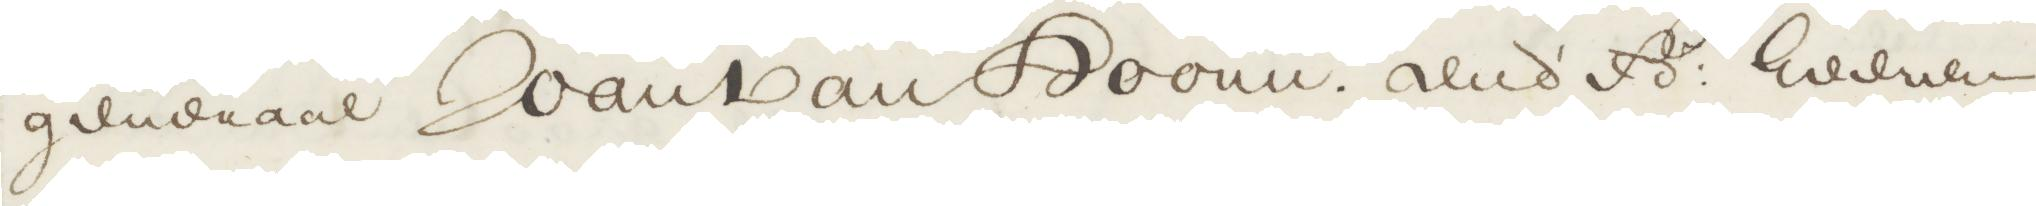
generaal Joan van Hoorn, en d’Ed:' heeren
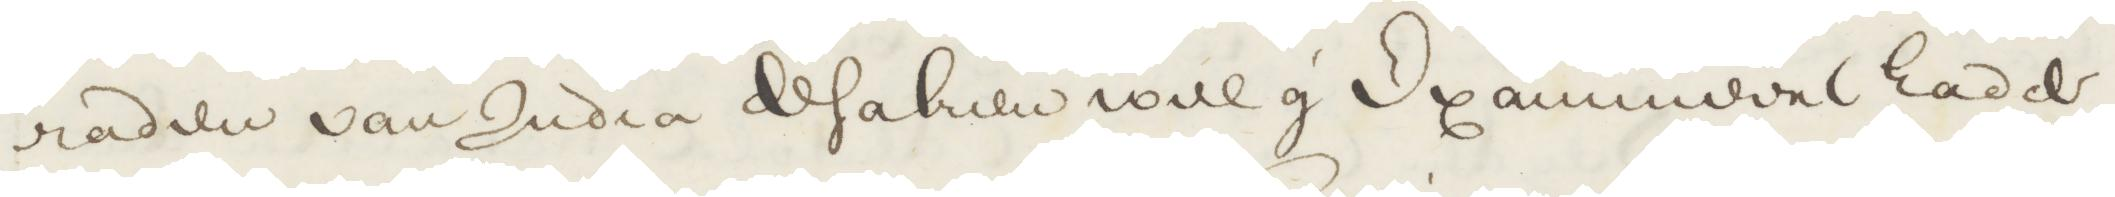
raden van Jndia de saken wel g’Examineert hadde
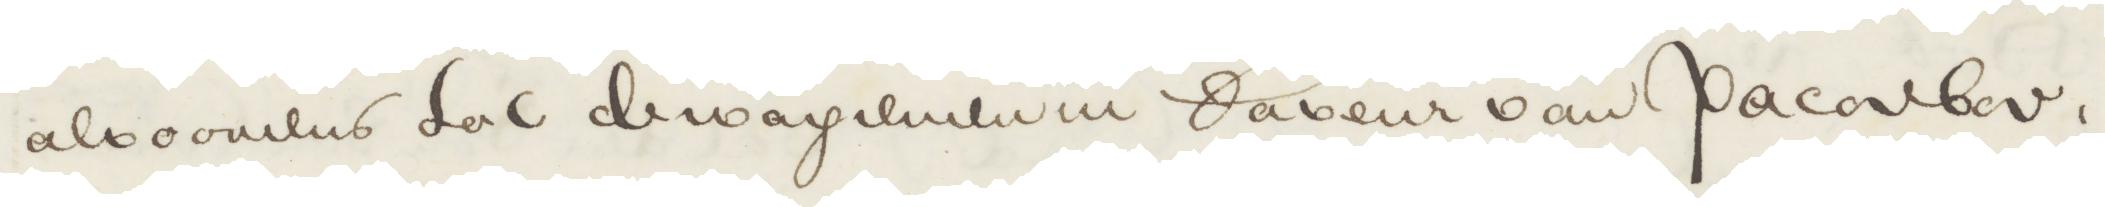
alvoorens tot de wapenen in faveur van Pacoeboe,
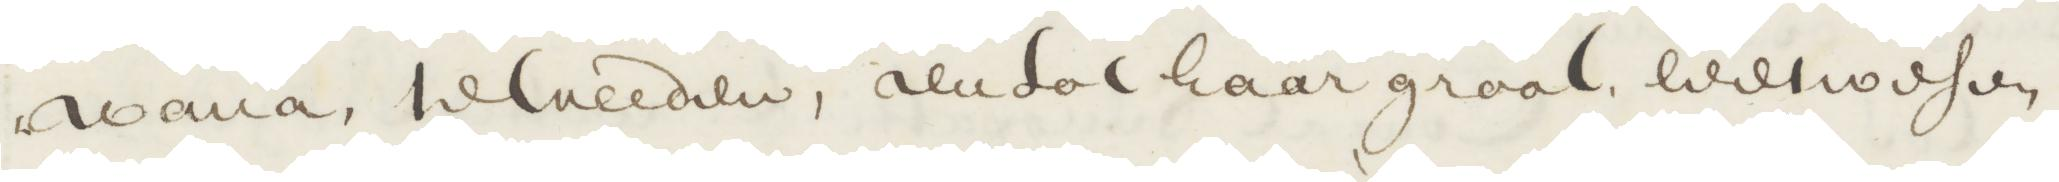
„wana, te treeden, en tot haar groot, leetwesen
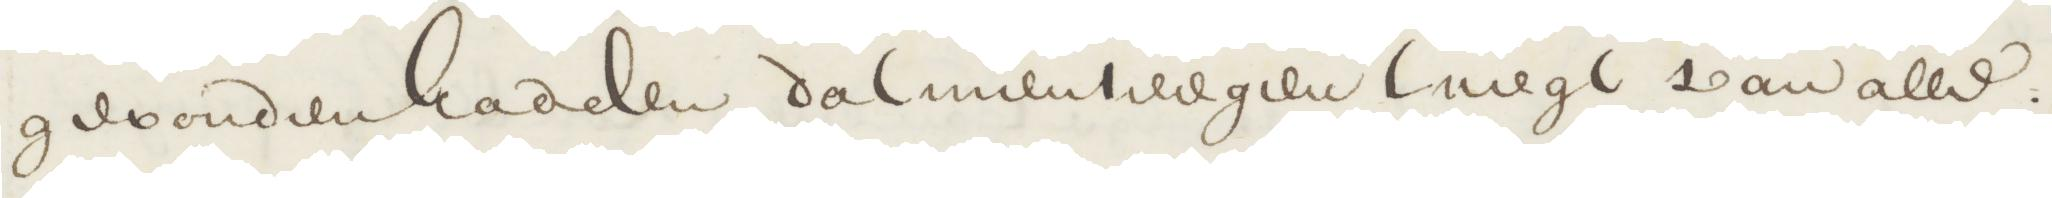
gevonden hadden dat men teegen 't regt van alle
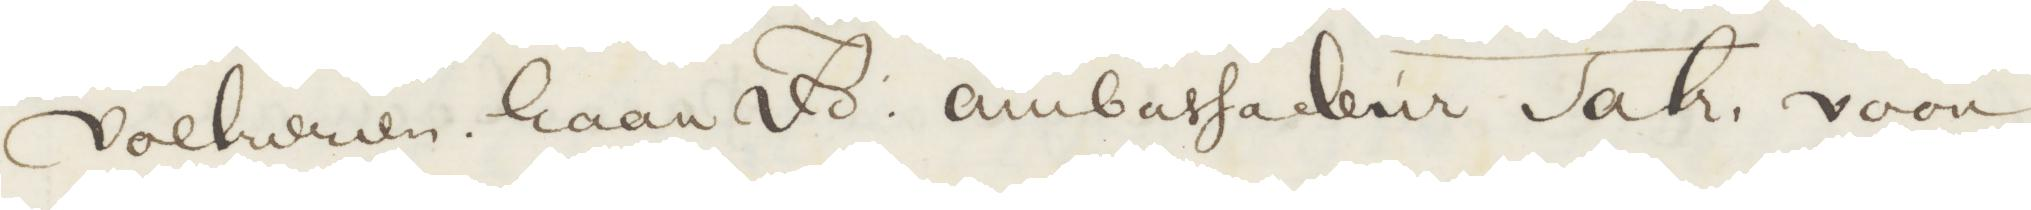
volkeren, haar Ed: ambassadeur Tak, voor
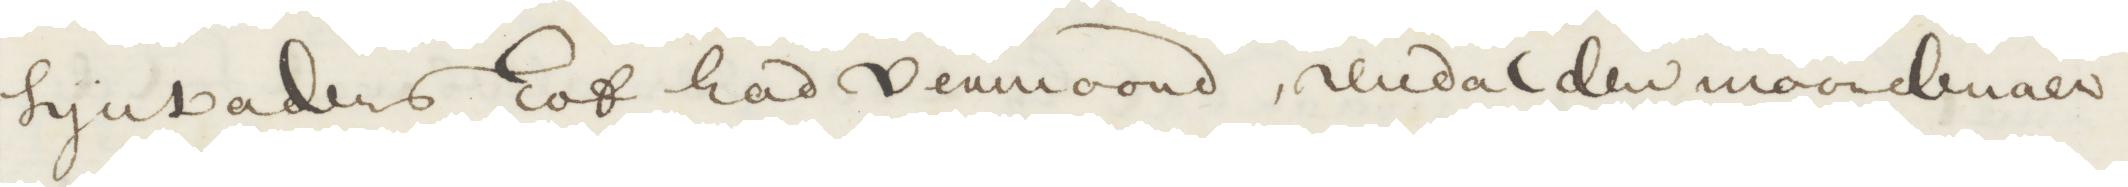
sijn vaders hof had vermoord, en dat den moordenaer
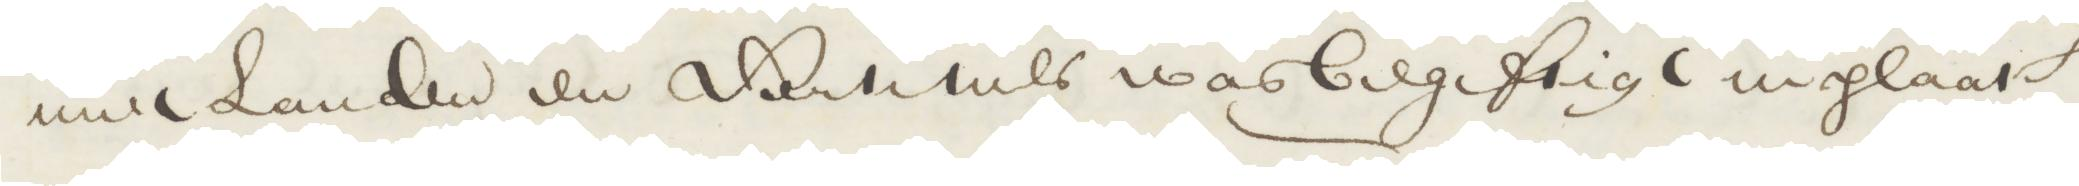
met Landen en Eertituls was begiftigt in plaats
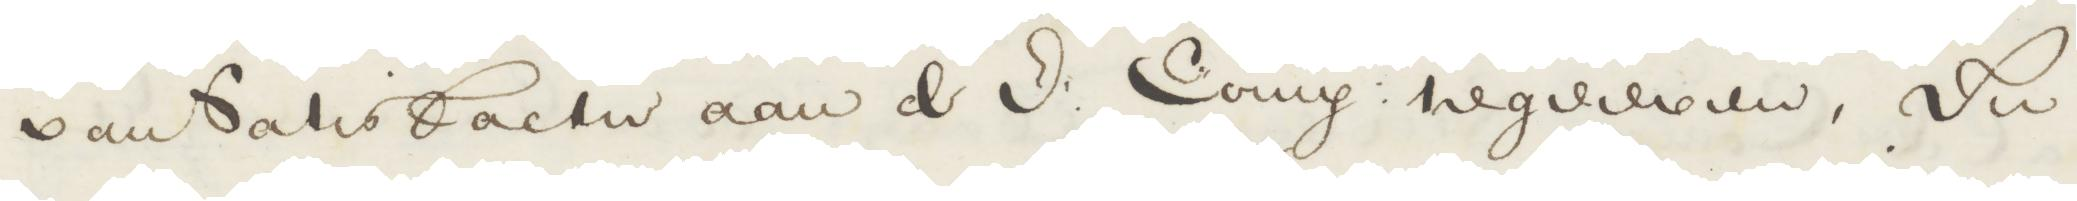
van satisfactie aan de E: Comp: te geeven, En
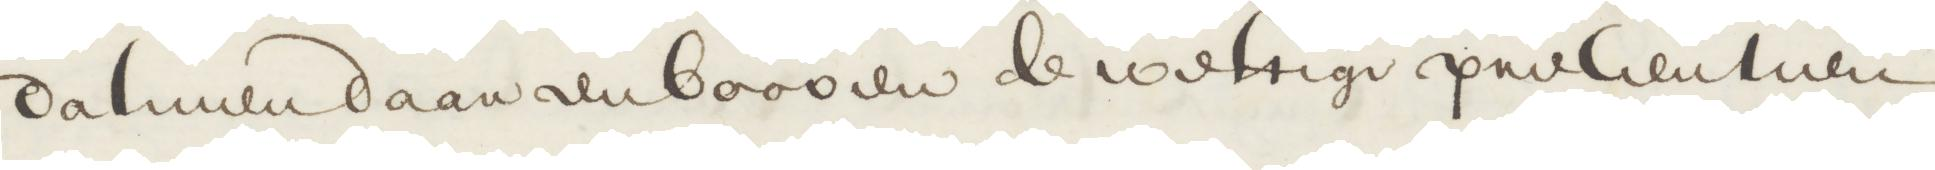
dat men daar en booven de wettige pretentien
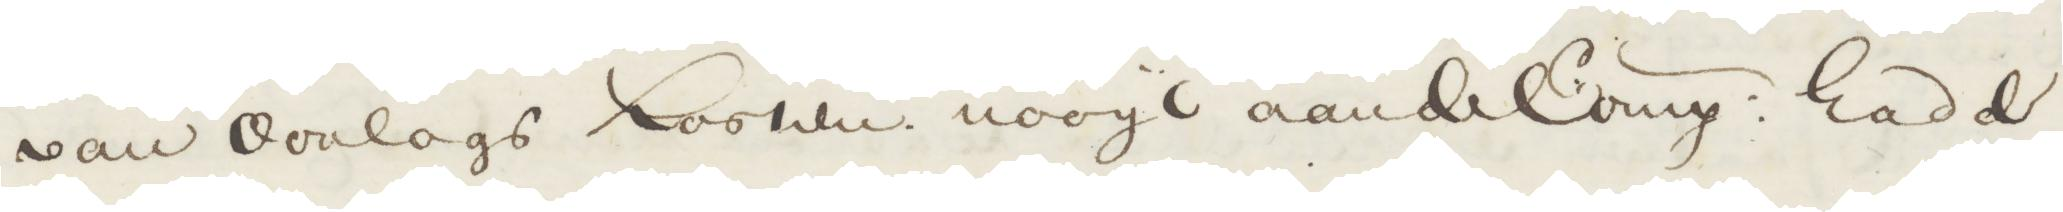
van Oorlogs kosten nooijt aan de Comp: hadde
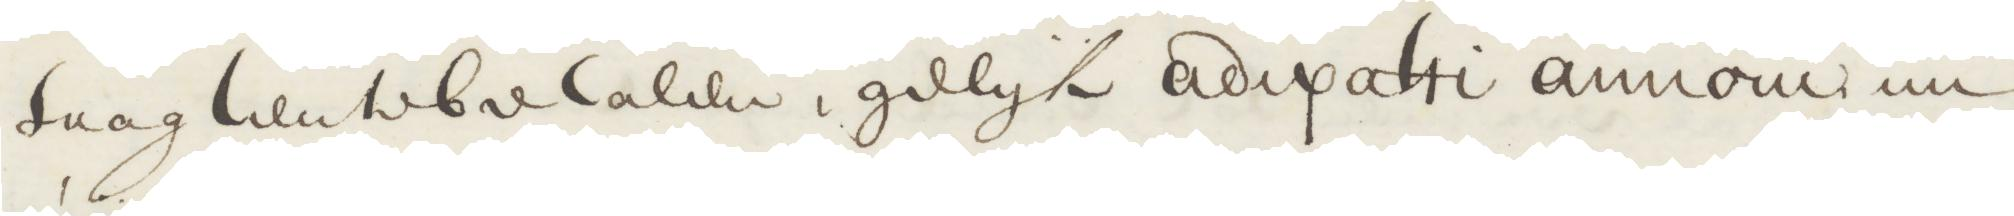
tragten te betalen, gelijk adipatti annom, nu
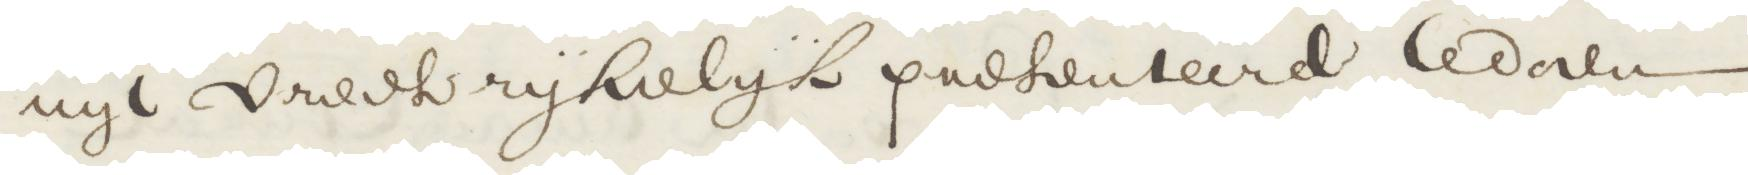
uijt vreese rijkelijk presenteerde te doen
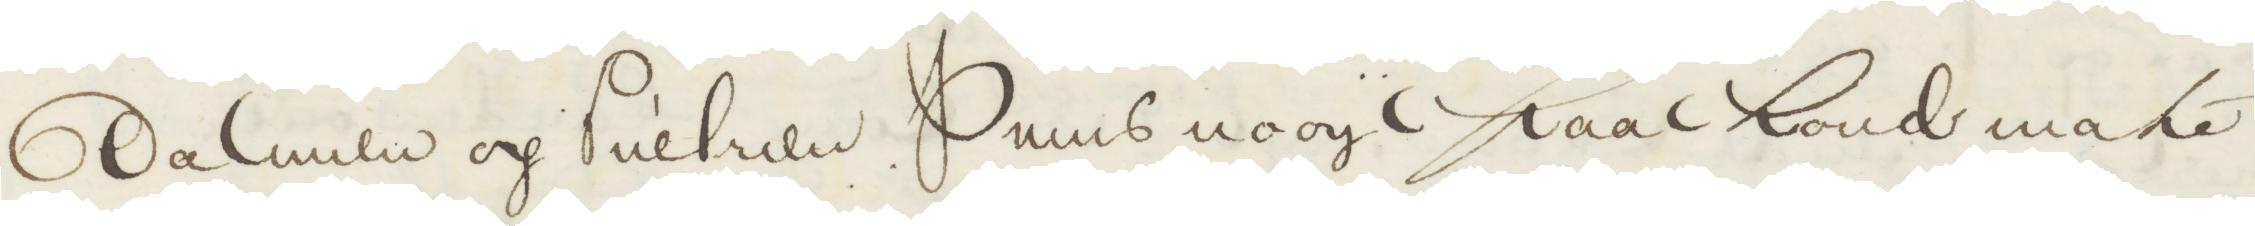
Dat men op sulken Prins nooijt staat konde make
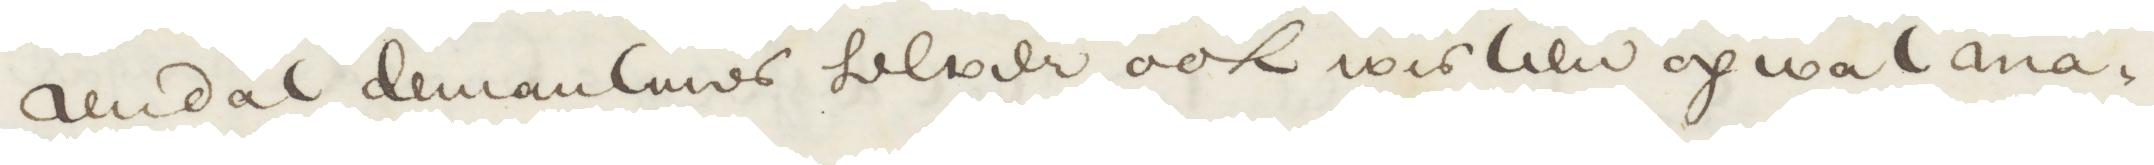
en dat de mantries selver ook wisten op wat ma„
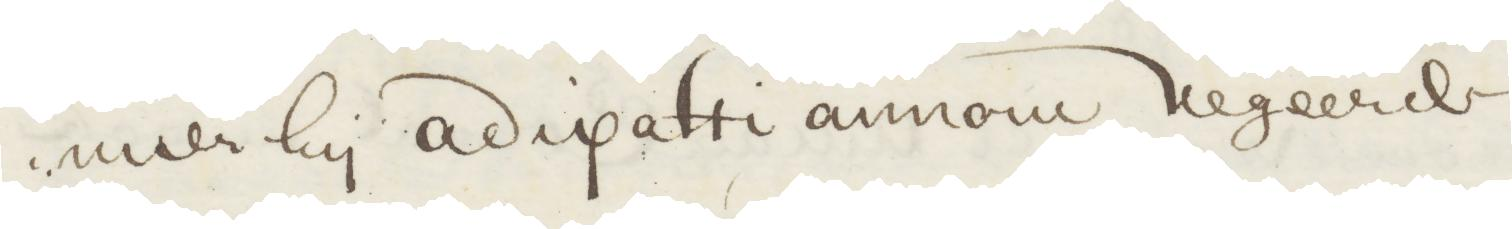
„nier hij adipatti annom regeerde
